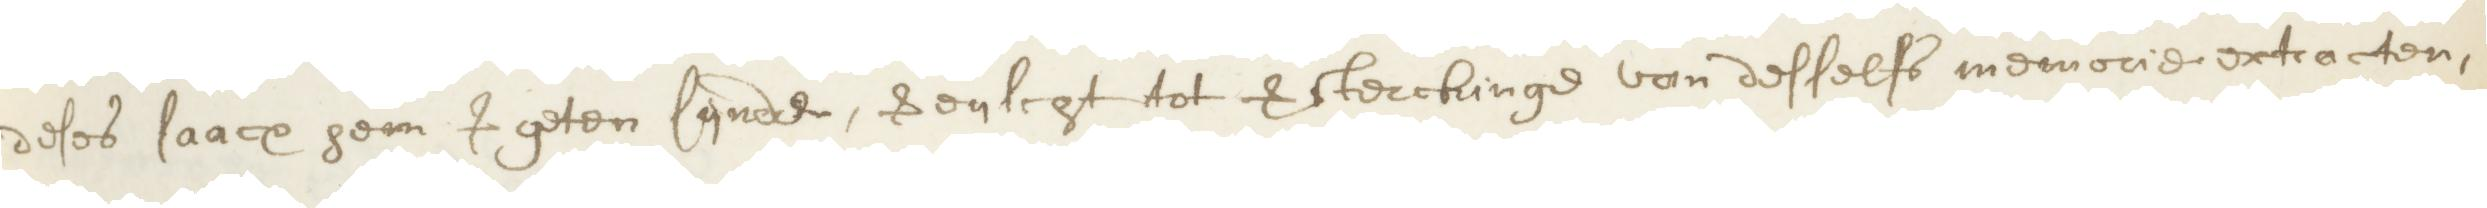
deses saacx hem ver geten sijnden, vereyscht tot versterckinge van desselfs memorie extracten,
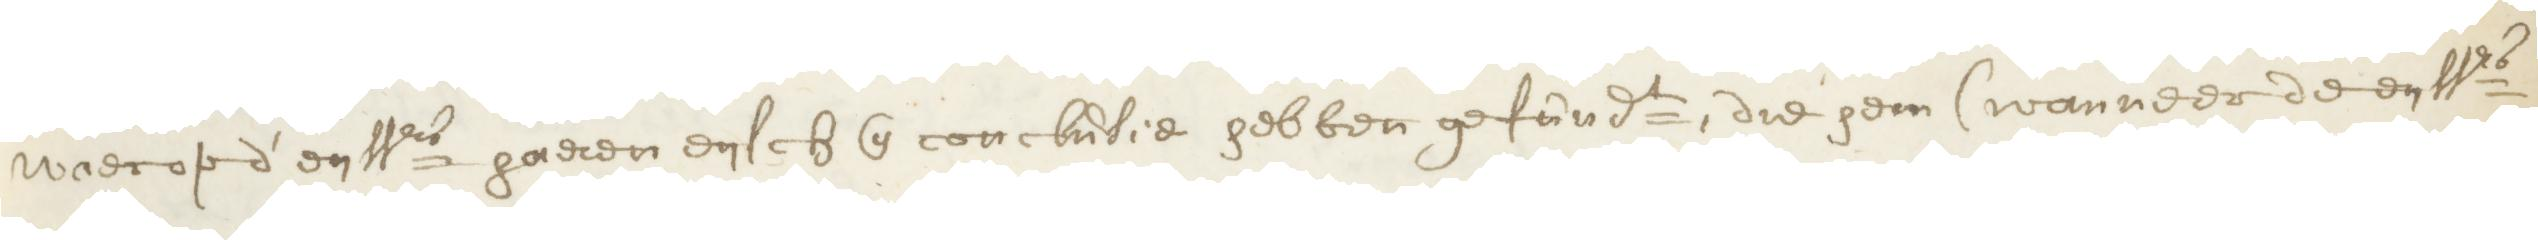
waerop d’ eyss=rs haeren eysch ende conclusie hebben gefund=t, die hem (wanneer de eyss=rs
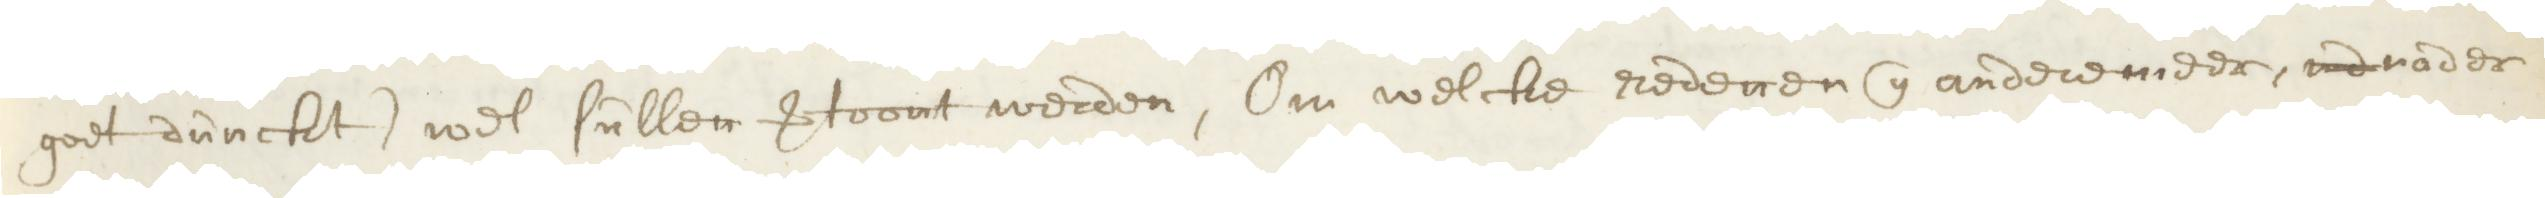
goetdunckt) wel sullen vertoont werden, Om welcke rederen ende andere meer, red nader
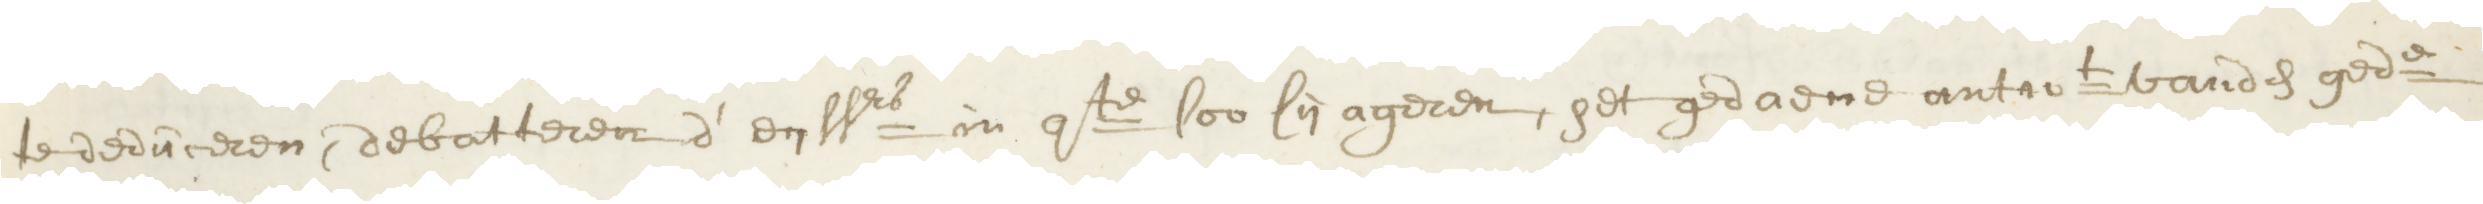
te deduceren, debatteren d’eijss=rs in q=te soo sij ageren, het gedaene antw=t van den ged=e
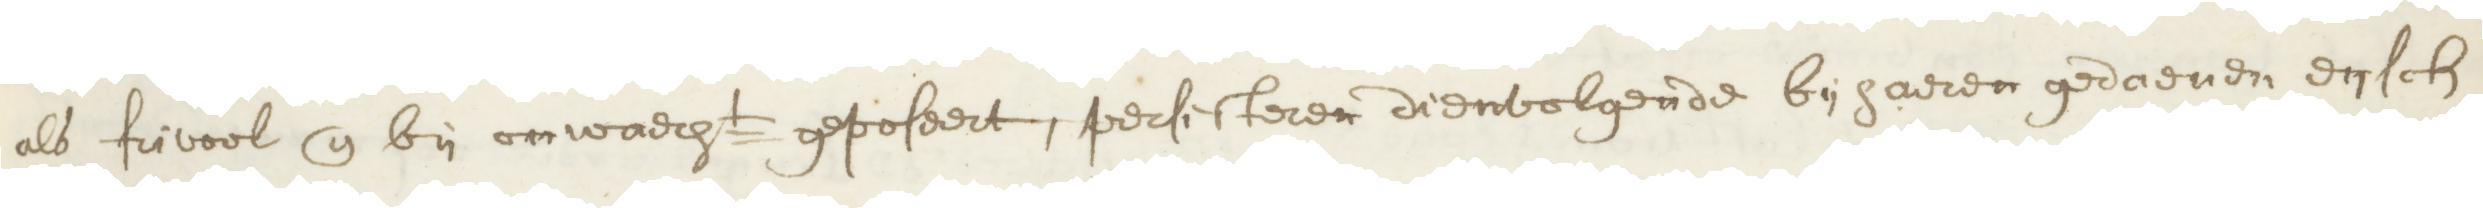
als frivool ende bij onwaerh=t geposeert, persisteren dienvolgende bij haeren gedaenen eysch
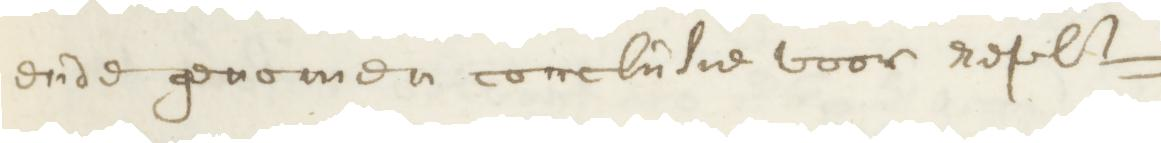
ende genomen conclusie voor repl=
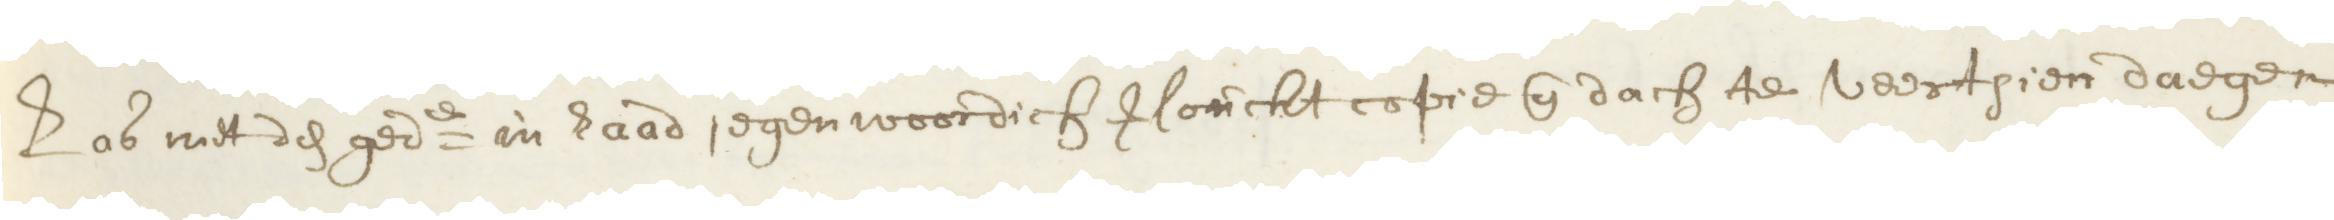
Zas met den ged=e in raad jegenwoordich versouckt copie ende dach te veerthien daegen
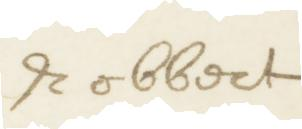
robbert
